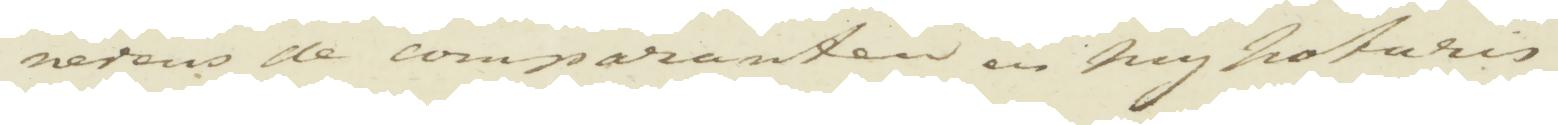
nevens de comparanten en my notaris
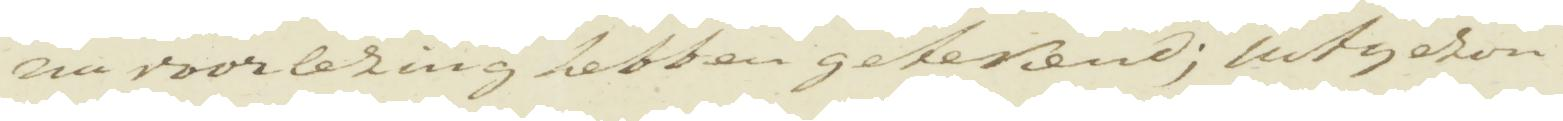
na voorlezing hebben getekend; uitgezon
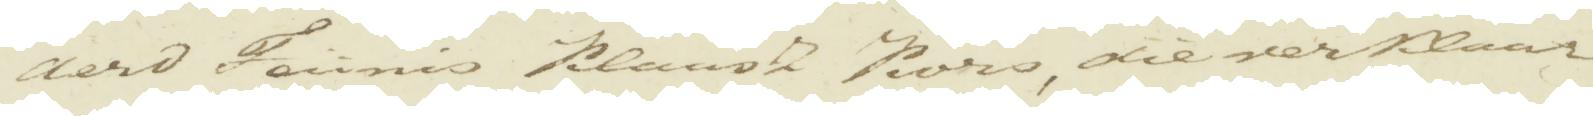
derd Teunis Klaasz Kors, die verklaar
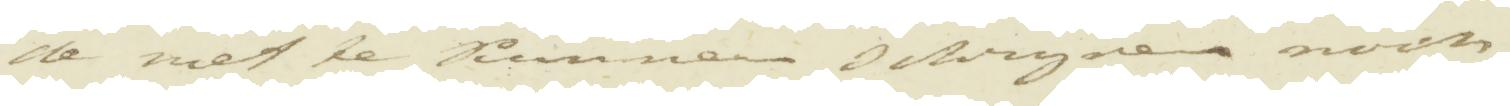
de niet te kunnen schrijven noch
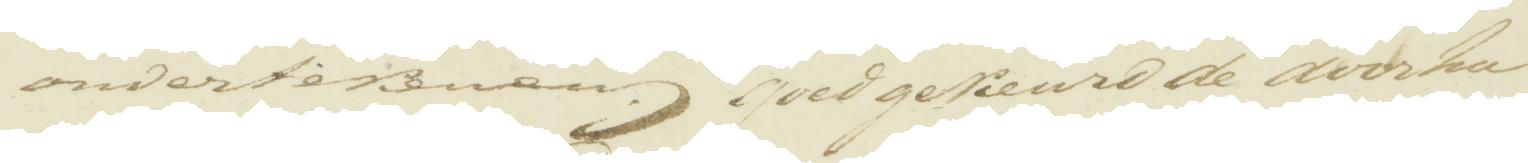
ondertekenen. goedgekeurd de doorha
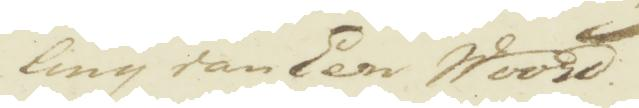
ling van Een Woord.
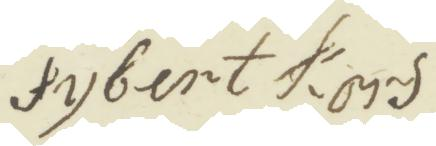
sybert Kors
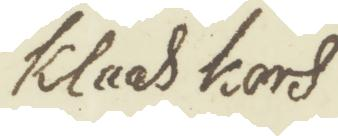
Klaas kors
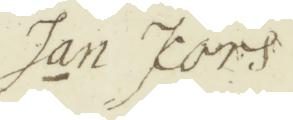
Jan Kors
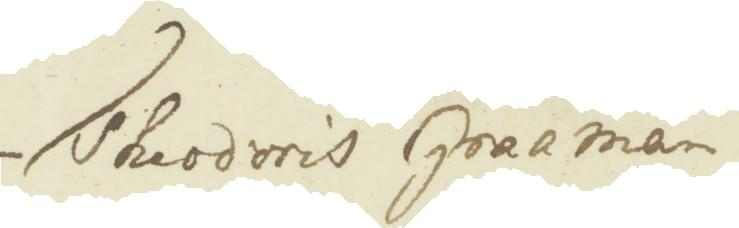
-Theodoris Graaman
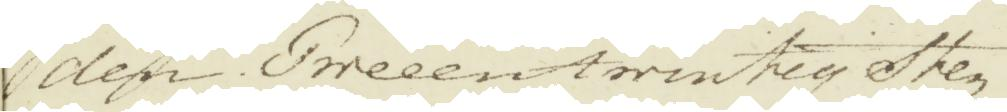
den. Tweeentwintigsten
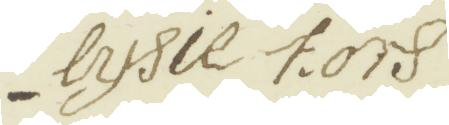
_lysie kors
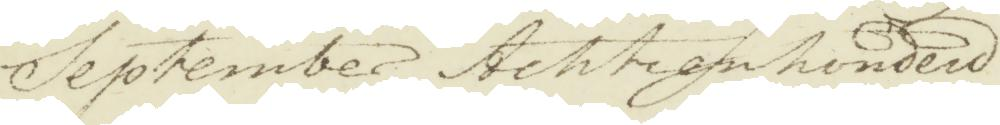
september Achtienhonderd
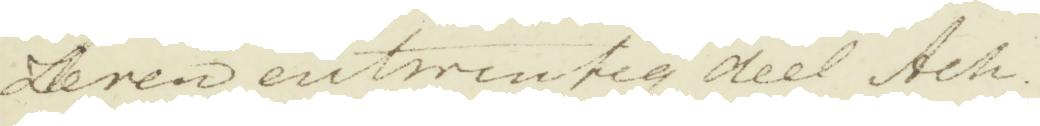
Zeven en twintig deel Ach.
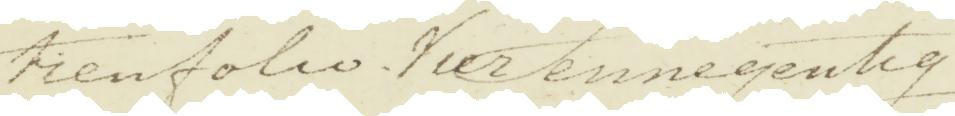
tien folio. Vier ennegentig
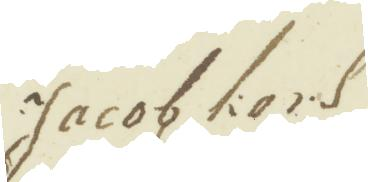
Jacob kors
